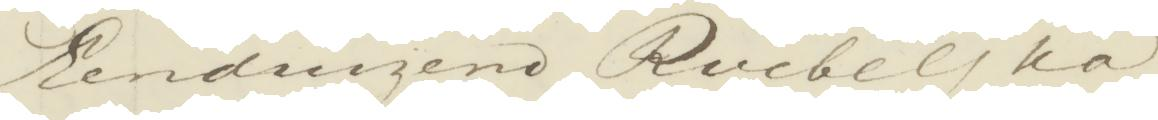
Een duizend Roebels ka
